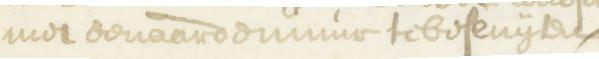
met denaad en mur te besluijten
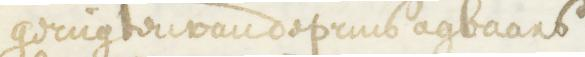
gerugten van de prins agbaars
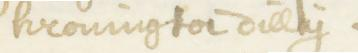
kroning tot dillij
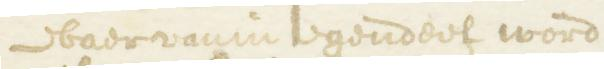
waer van in tegendeel word
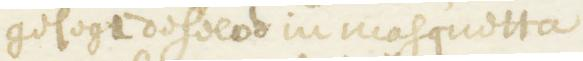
gesegt deselve in masquetta
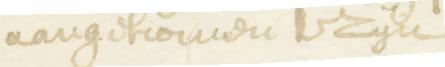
angekomen te zijn
